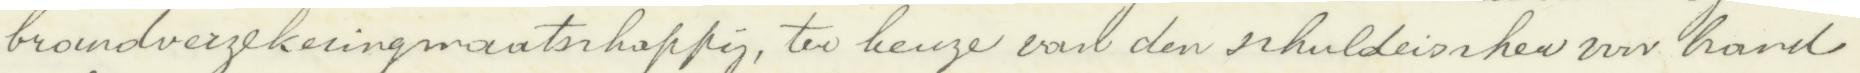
brandverzekeringmaatschappij, ter keuze van den schuldeischer voor brand
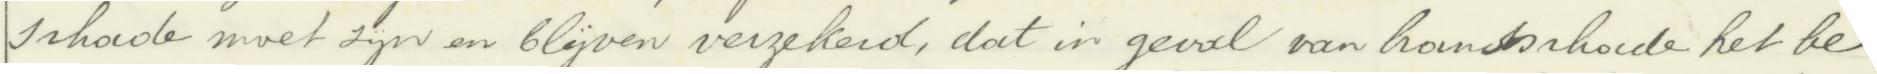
schade moet zijn en blijven verzekerd, dat in geval van brandschade het be
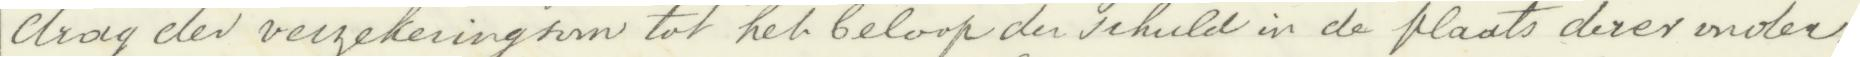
drag der verzekeringsom tot het beloop der schuld in de plaats dezer onder
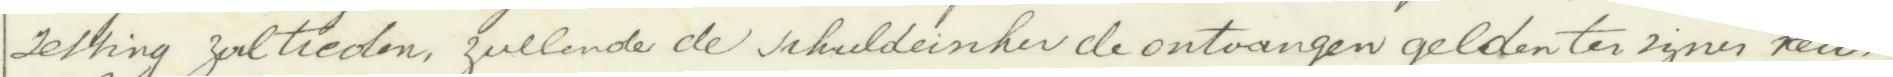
zetting zal treden, zullende de schuldeischer de ontvangen gelden ter zijner keu-
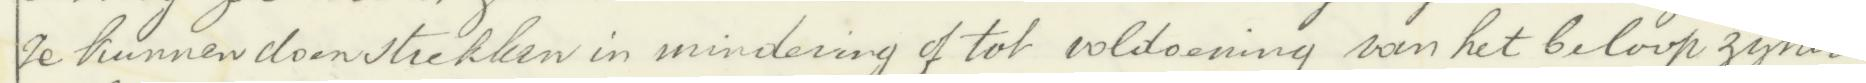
ze kunnen doen strekken in mindering of tot voldoening van het beloop zijner
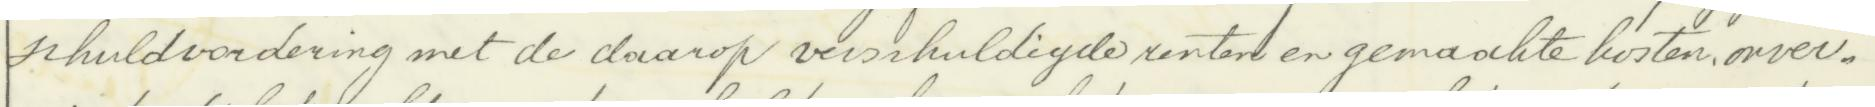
schuldvordering met de daarop verschuldigde renten en gemaakte kosten, onver-
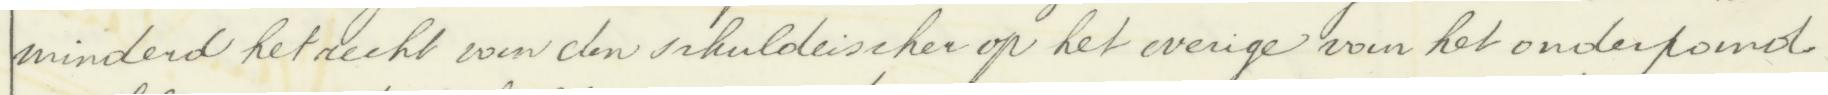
minderd het recht van den schuldeischer op het overige van het onderpand.
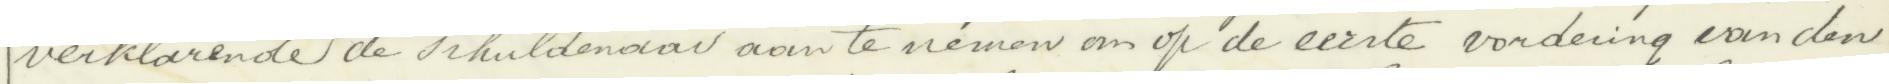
verklarende de schuldenaar aan te nemen om op de eerste vordering van den
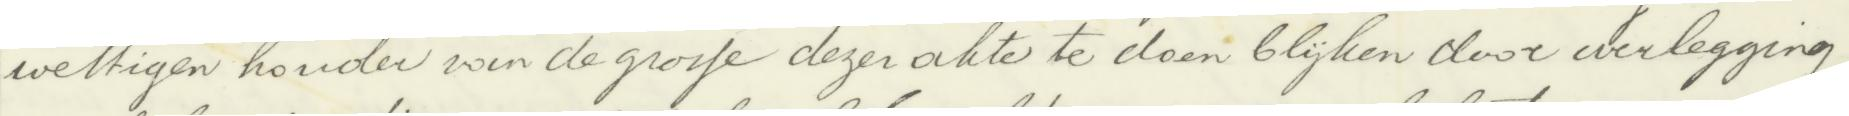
wettigen houder van de grosse dezer akte te doen blijken door overlegging
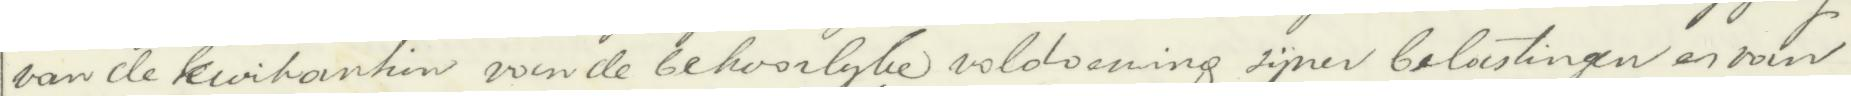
van de kwitanten van de behoorlyke voldoening zijner belastingen en van
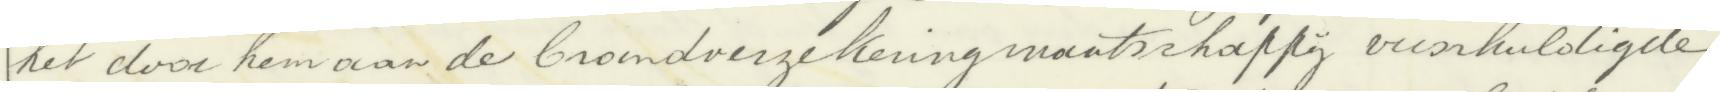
het door hem aan de brandverzekeringmaatschappij verschuldigde
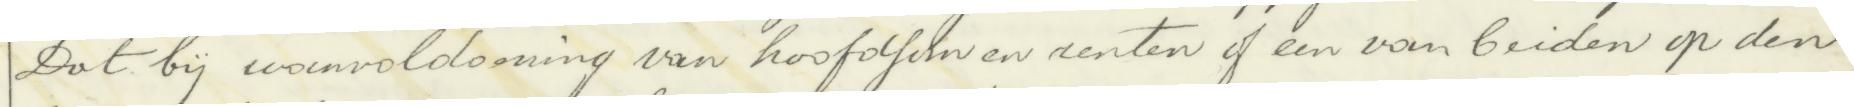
Dat bij wanvoldoening van hoofdsom en renten of een van beiden op den
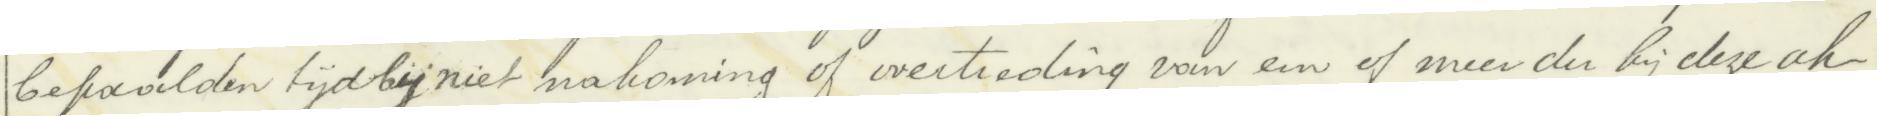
bepaalden tijd bij niet nakoming of overtreding van een of meer der bij deze ak-
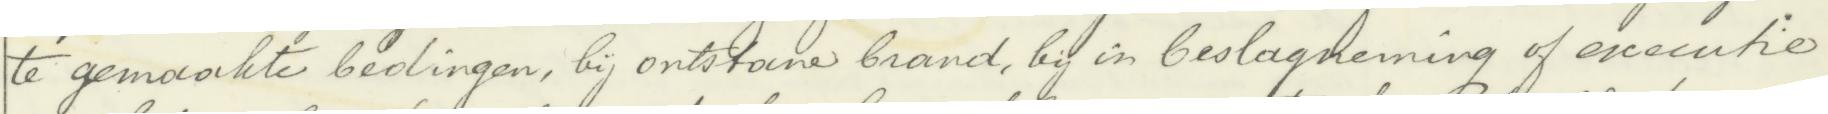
te gemaakte bedingen, bij ontstane brand, bij in beslagneming of executie
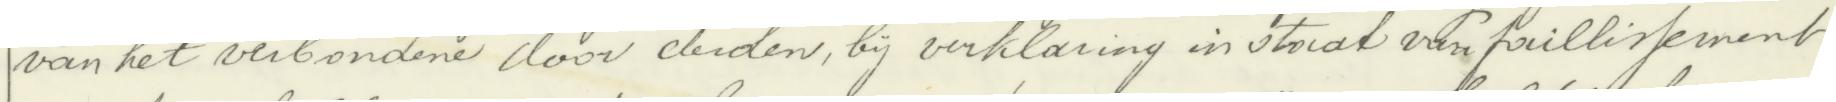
van het verbondene door derden, bij verklaring in staat van faillissement
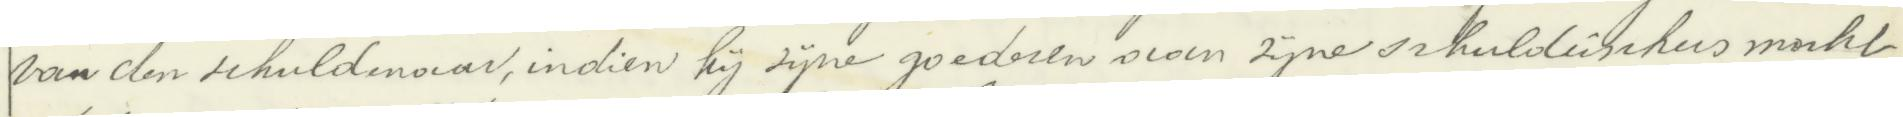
van den schuldenaar, indien hij zijne goederen van zijne schuldeischers mocht
